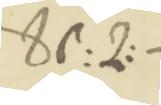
85:2:—
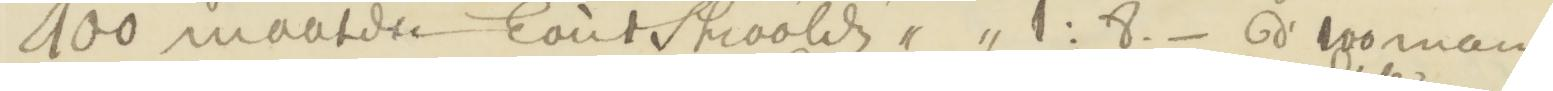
400 maaten houtskoolen „ „ 1: 8.— d’ 100 man
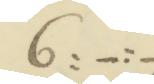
6: —:—
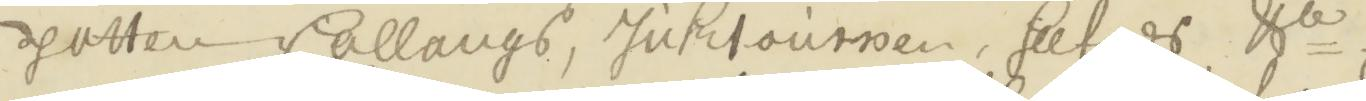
potten Callangs, Juktouwen, seefjes &=a
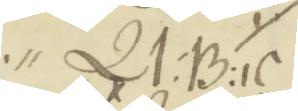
„ 21:13: 1/15
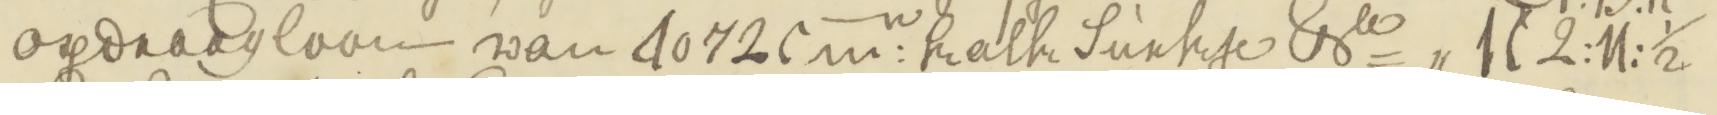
opdraagloon van 40725 m:n kalk Surkje &=a „ 112:11:½.
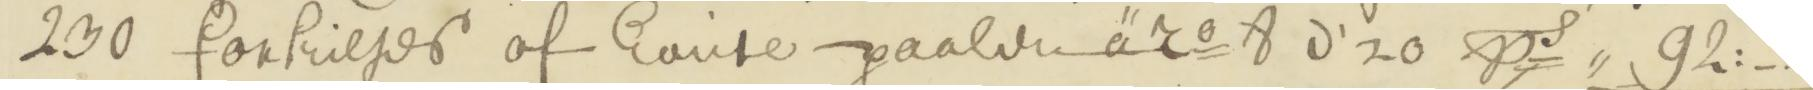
230 forkiljes of houte paalen â r:o 8 d' 20 p=s „ 92:—:—
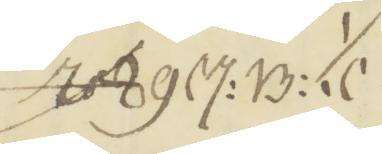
r/o 8957: 13: 1 /15
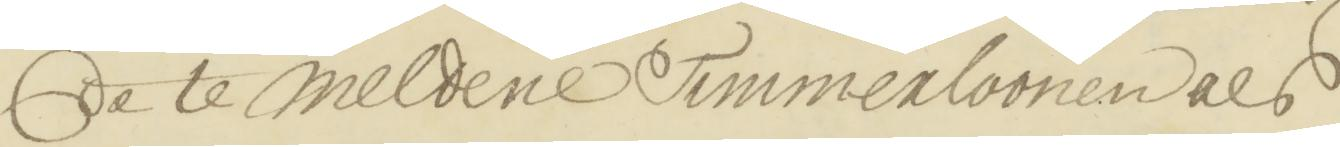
de te meldene Timmerloonen als
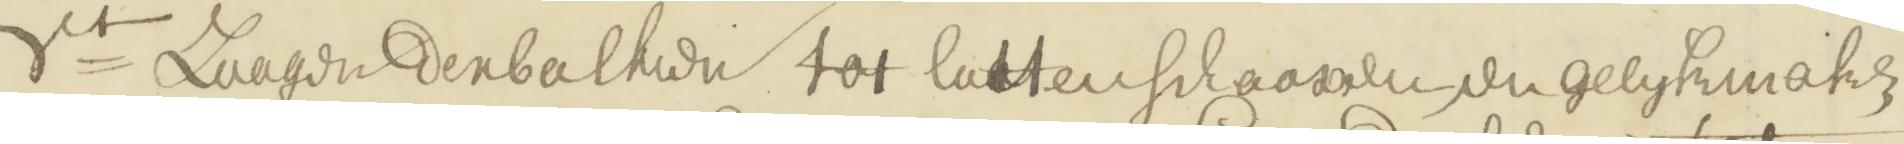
V=t Zaagen der balken tot latten schaaven en gelykmaken
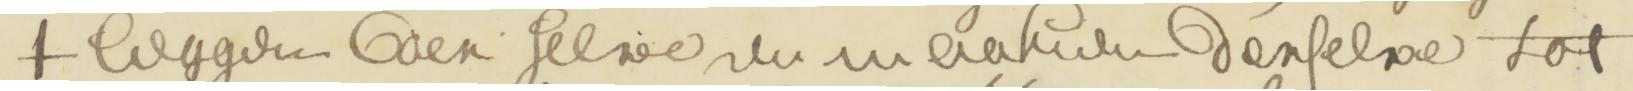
’t leggen der selve en maaken derselve tot
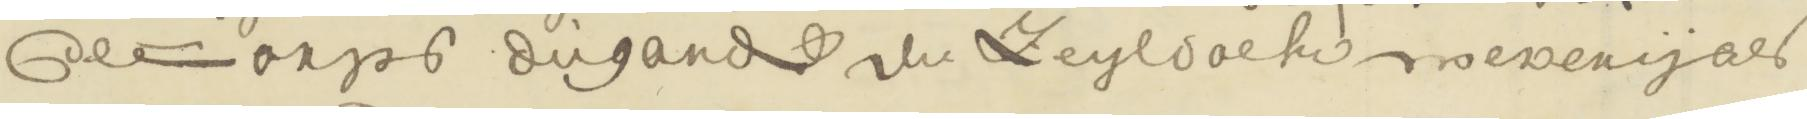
De corps dugarde en Zeyldoek weverij als
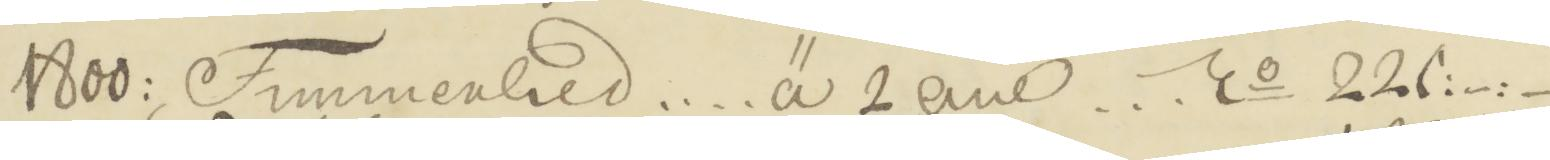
1800: Timmerlied - - - â 2 ane - . . r=o 225:–:—
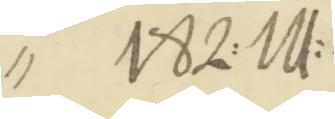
„ 182:14:
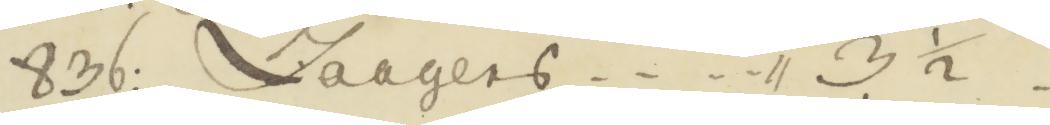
836: Zaagers - - - - „ 3½
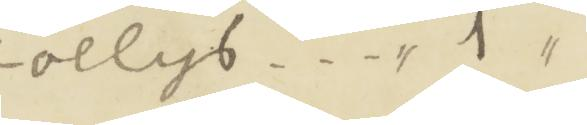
Collys - - - „ 1 „
